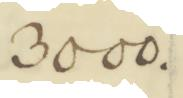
3000.
